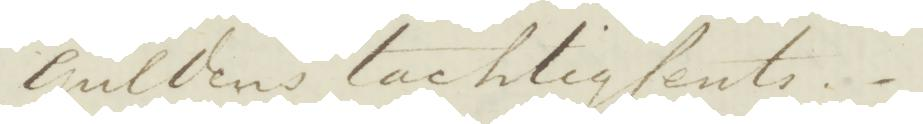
Guldens tachtig Cents.-
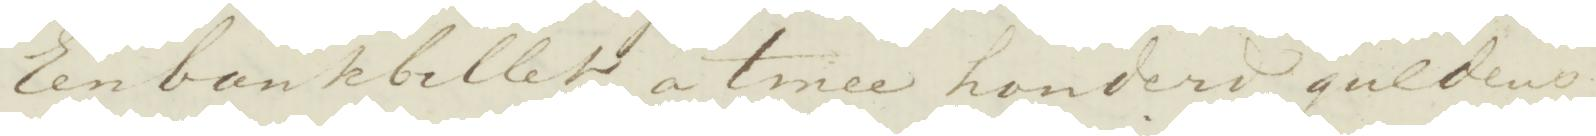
Een bankbillet a twee honderd guldens.
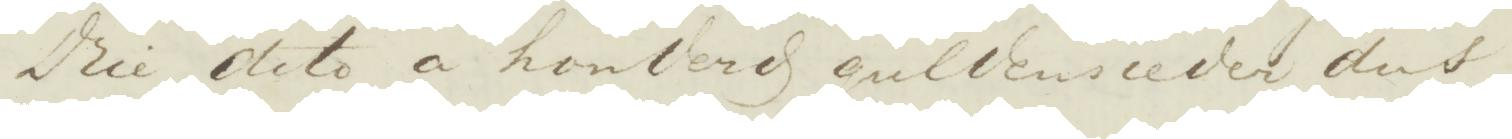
Drie dito a honderd guldens ieder dus
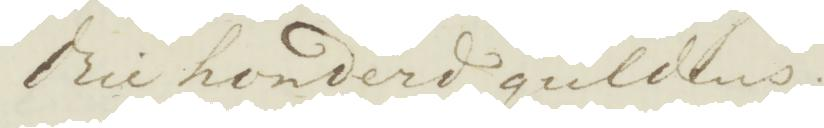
drie honderd guldens
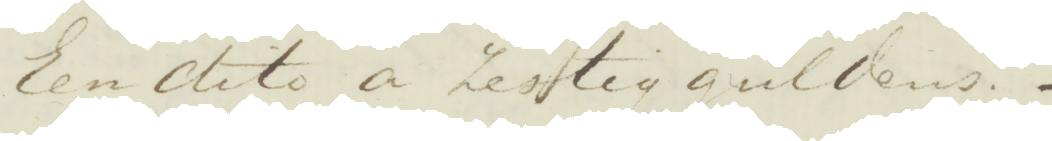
Een dito a zestig guldens.
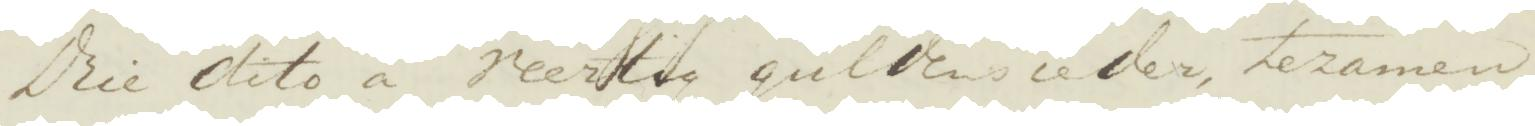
Drie dito à Veertig guldens ieder, tezamen
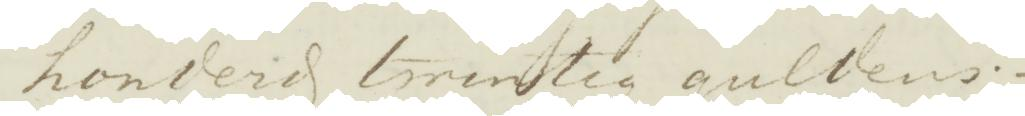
honderd twintig guldens
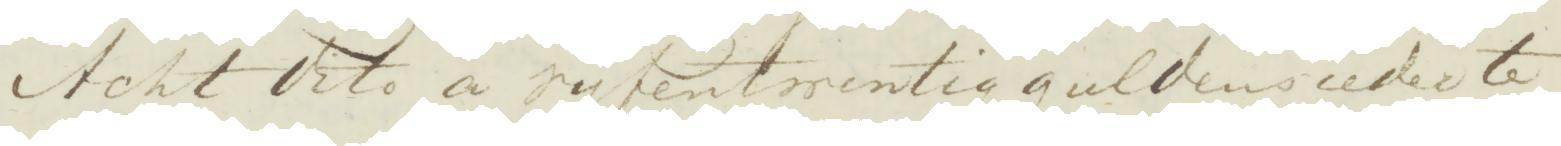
Acht dito à vijfentwintig guldens ieder te
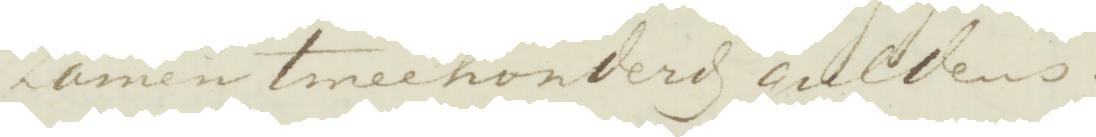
zamen tweehonderd guldens
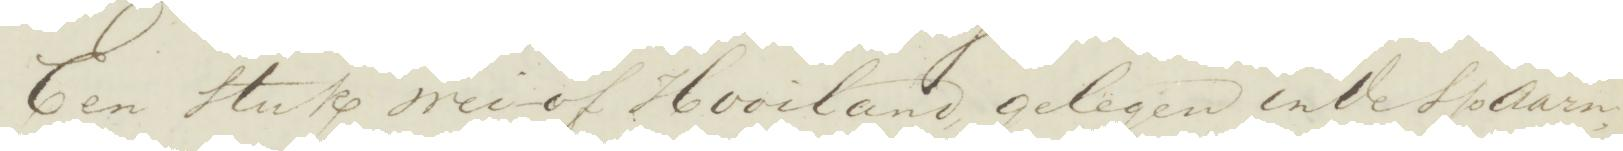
Een stuk wei- of Hooiland, gelegen in de spaarn„
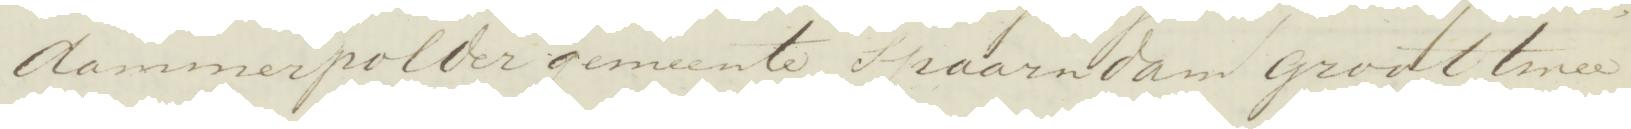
dammerpolder gemeente spaarndam groot twee
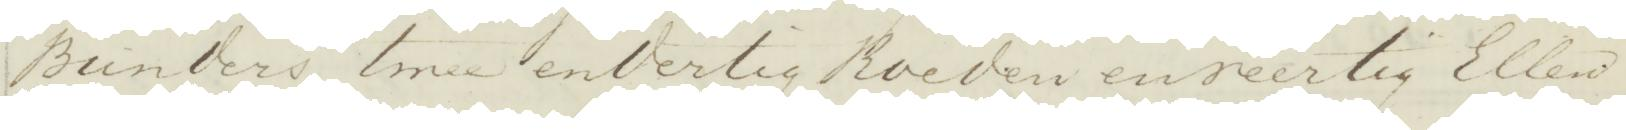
Bunders twee en dertig Roeden en veertig Ellen
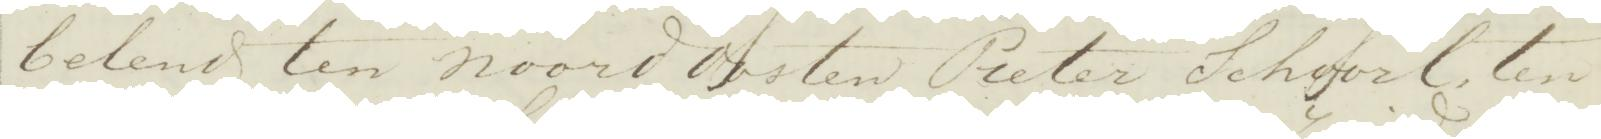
belend ten noord oosten Pieter Schoorl, ten
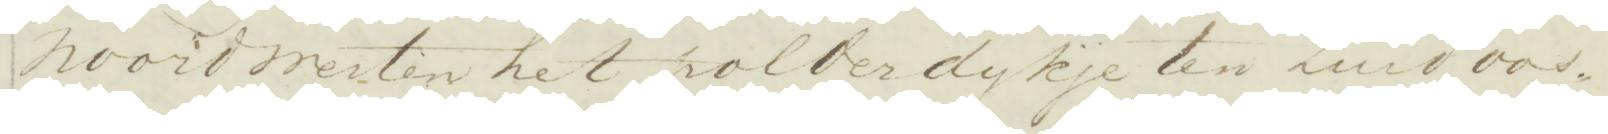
noordwesten het polder dykje ten zuid oos„
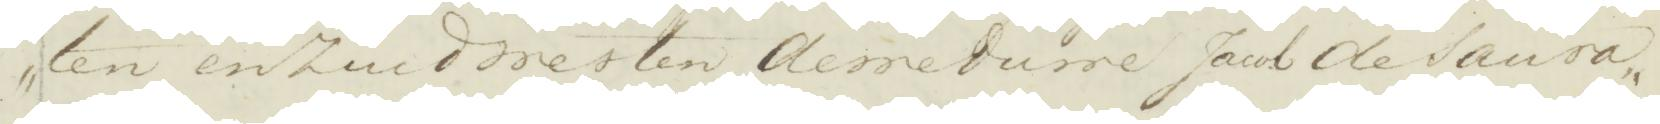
„ten enzuidwesten deweduwe Jacob de Sauva„
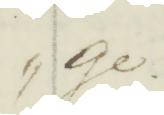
„ge
